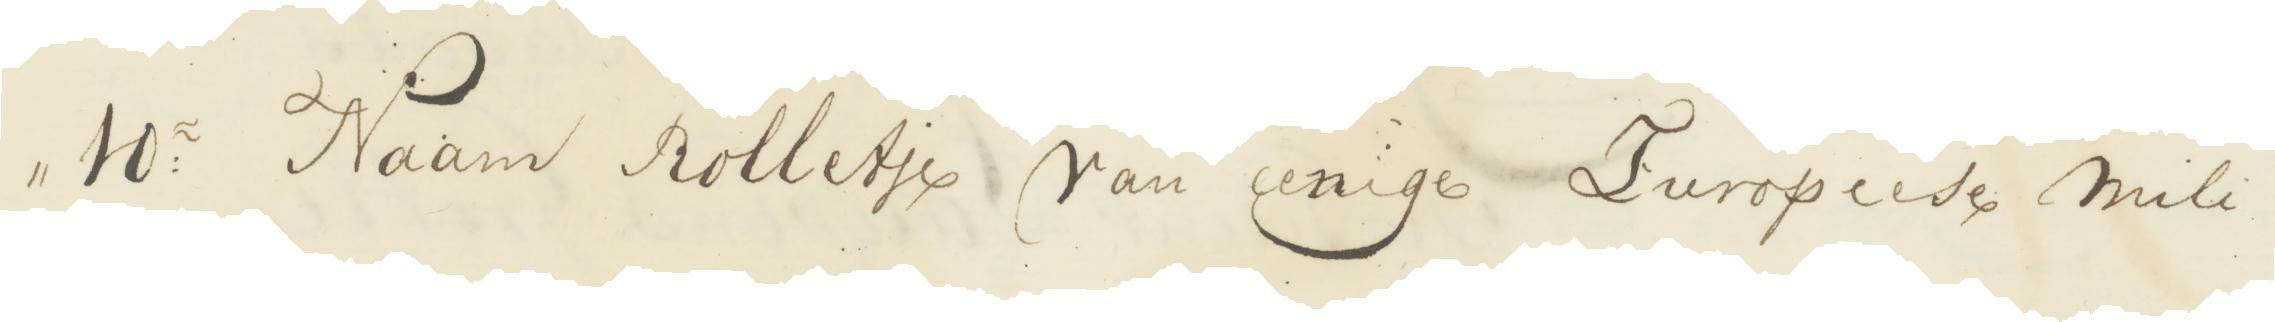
„ 10:= Naam Rolletje van eenige Europeese mili
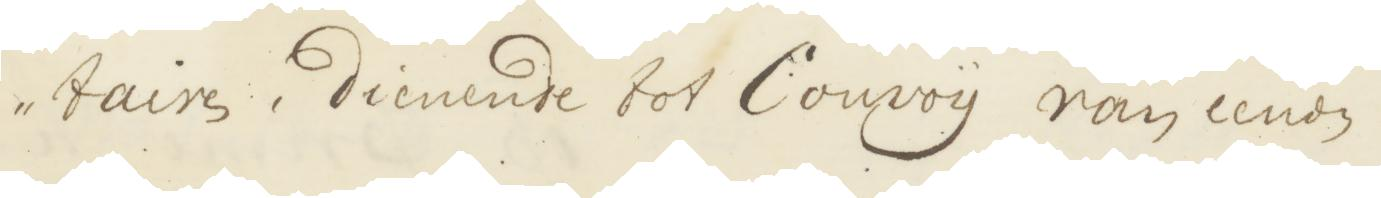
„tairen, dienende tot Convoij van eenden
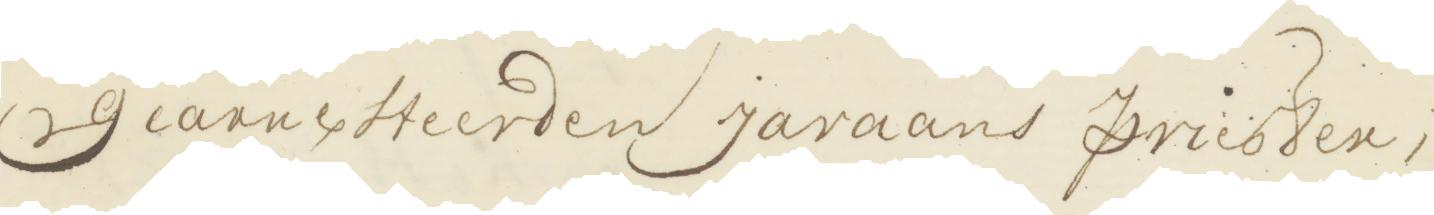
gearresteerden Javaans priester
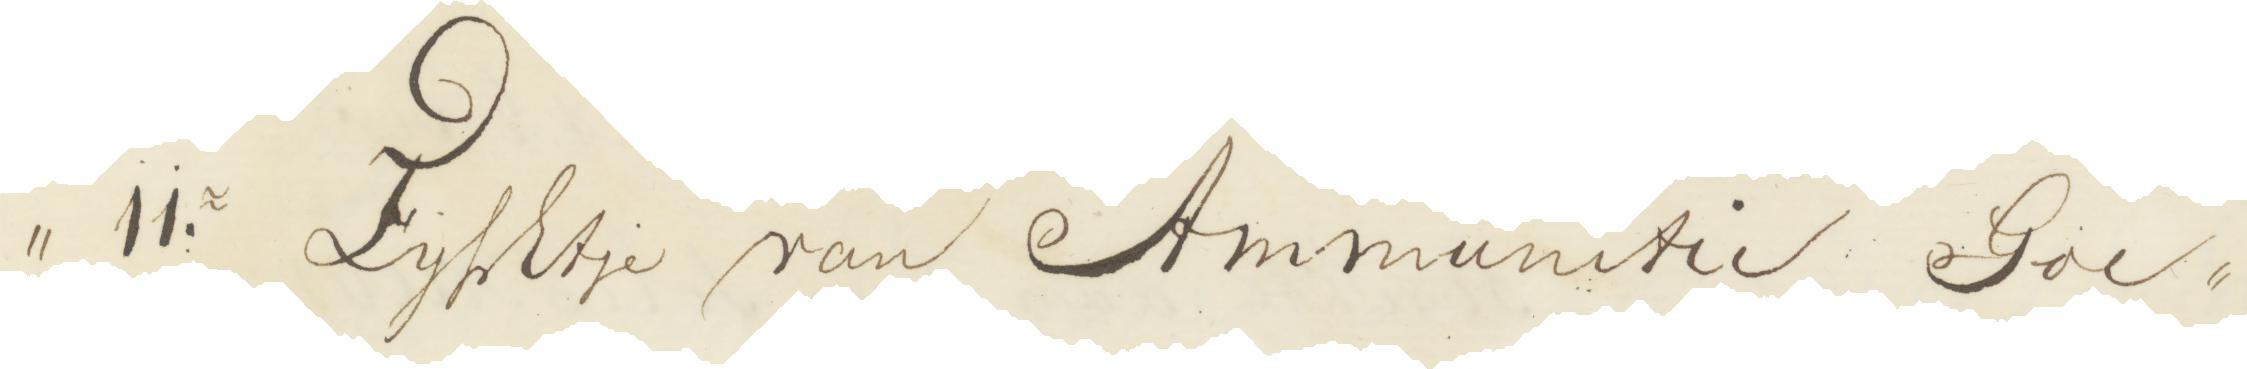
„ 11:= Eijschtje van Ammunitie Goe„
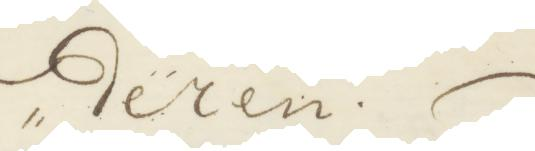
„deren.
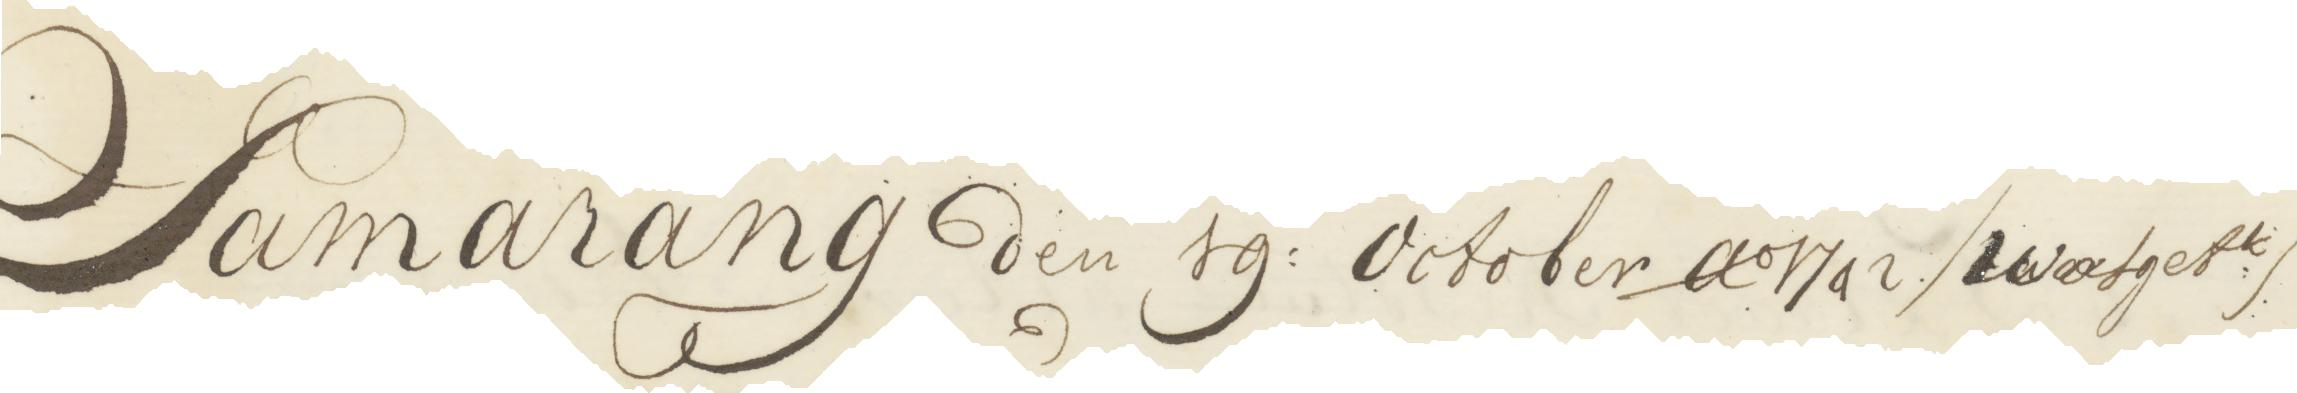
Samarang den 19:' October Ao 1742. /was get:t/
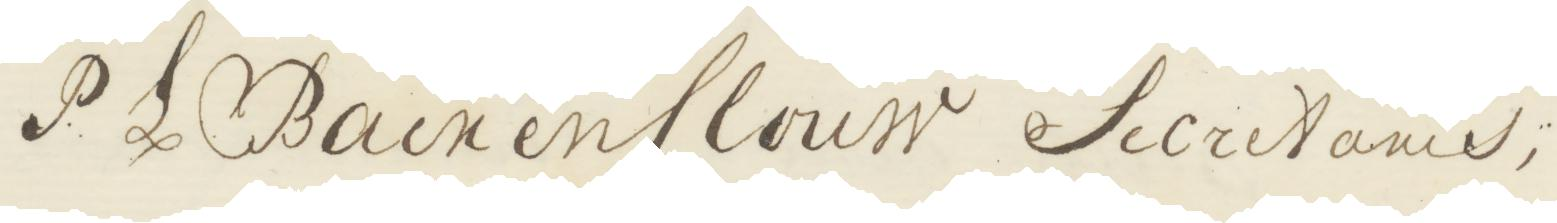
P: L Baerenclouw Secretaris;
